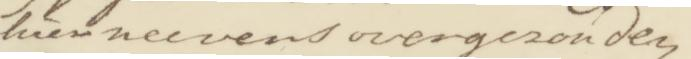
hier neevens overgezonden
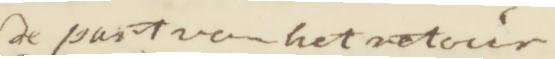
de part van het retour
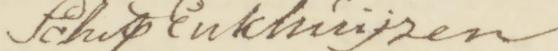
schip Enkhuijzen
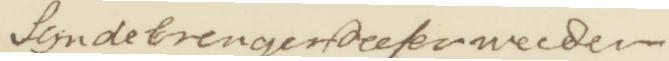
sijnde brenger deeser weeder
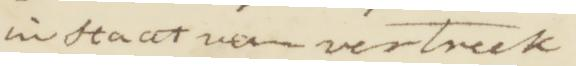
in staat van vertreck
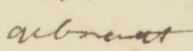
gebragt
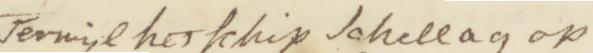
terwijl het schip schellag op
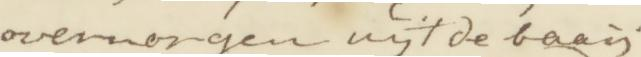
overmorgen uijt de baaij
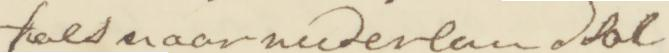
fals naar neederland sal
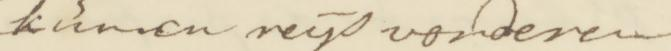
kunnen reijs vorderen
